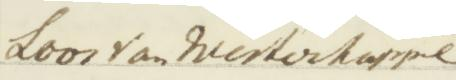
Loos van Westerkappel
